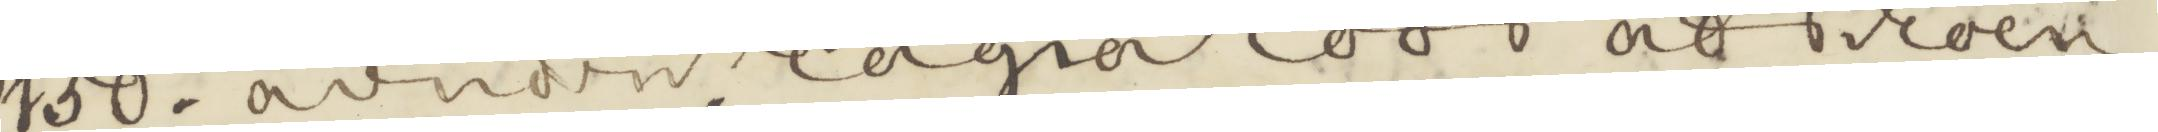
150. aenden ragia roos of schoen
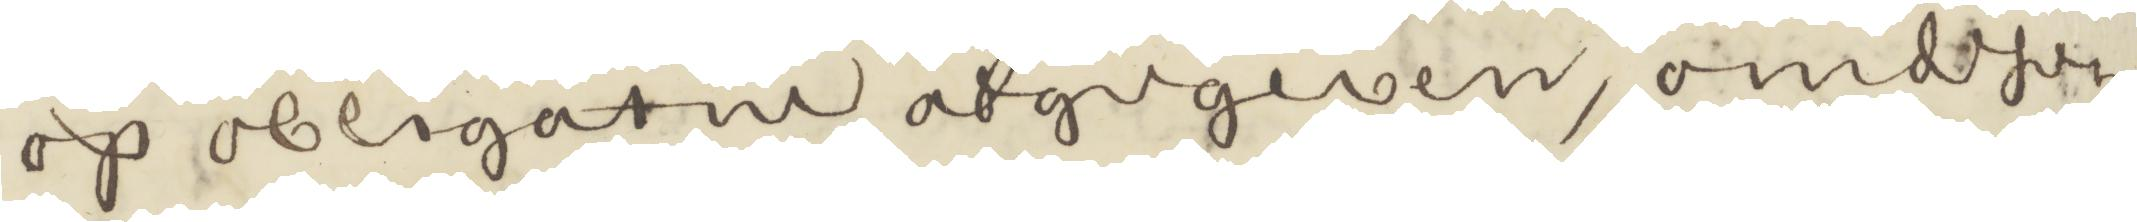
op obligatie afgegeven, om desen
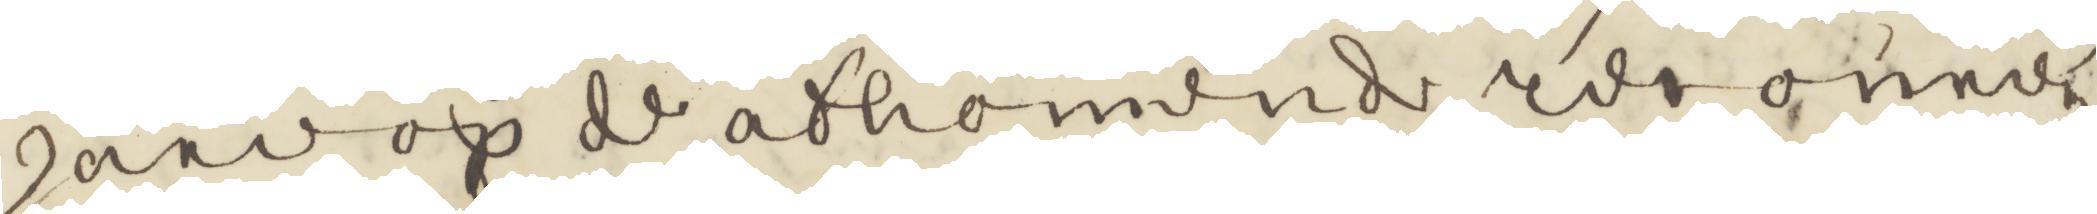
Jare op de afkomende retouren
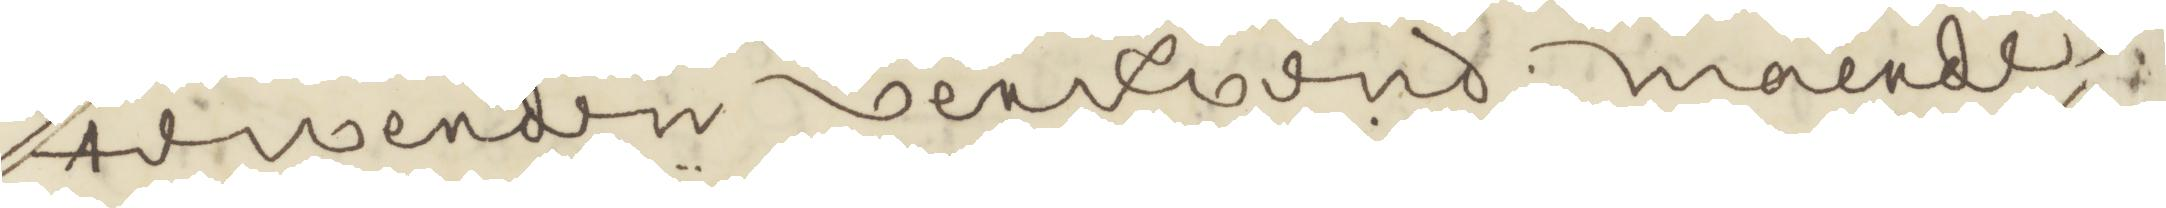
te werden verEvend; maer de„
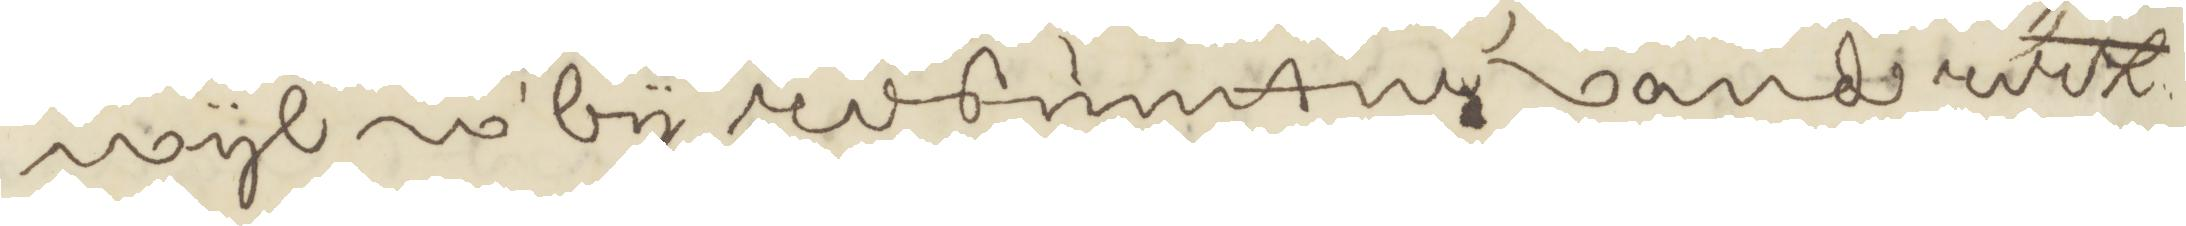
wijl w' bij resumtie vande reek.
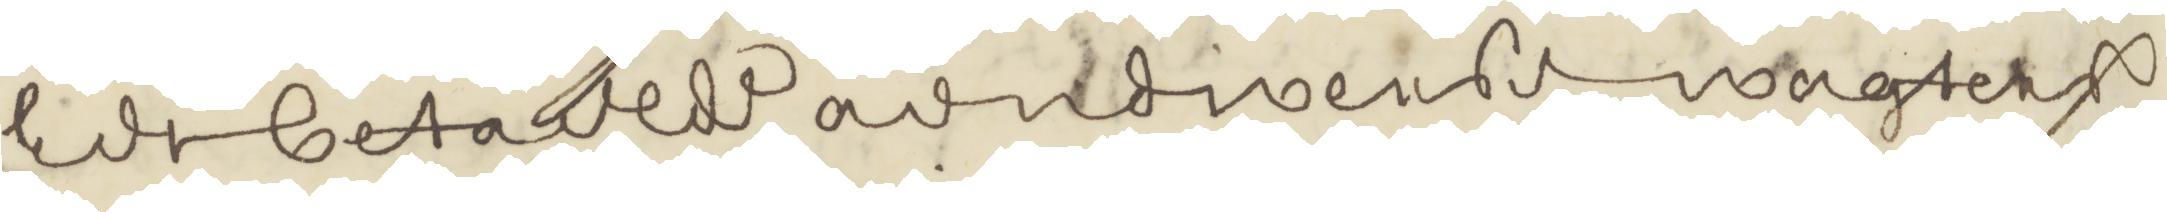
het betaelde aen diverse wagters
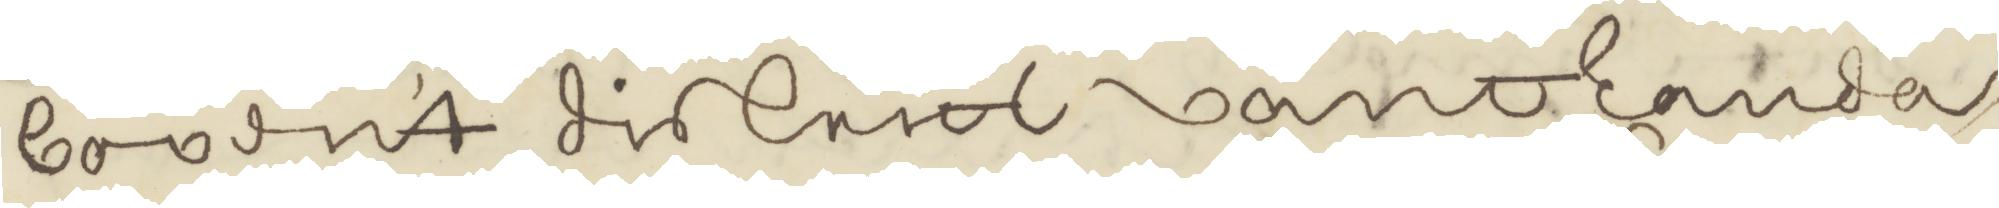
boven 't district van chanda
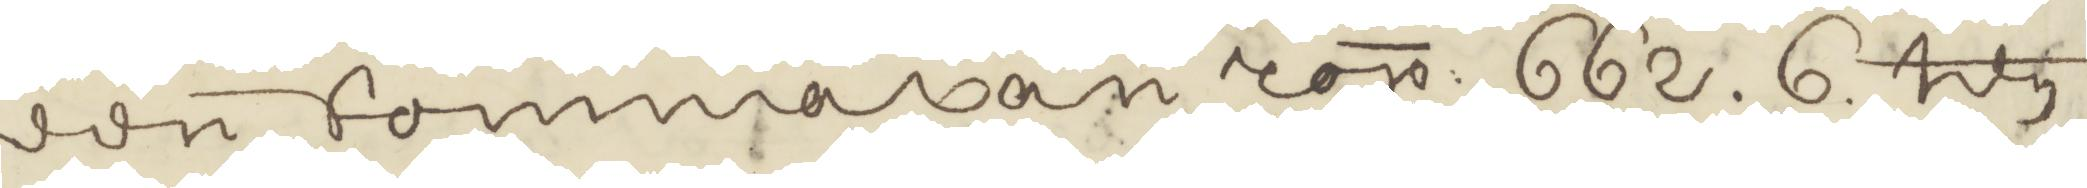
een somma van rop: 662. 6. ten
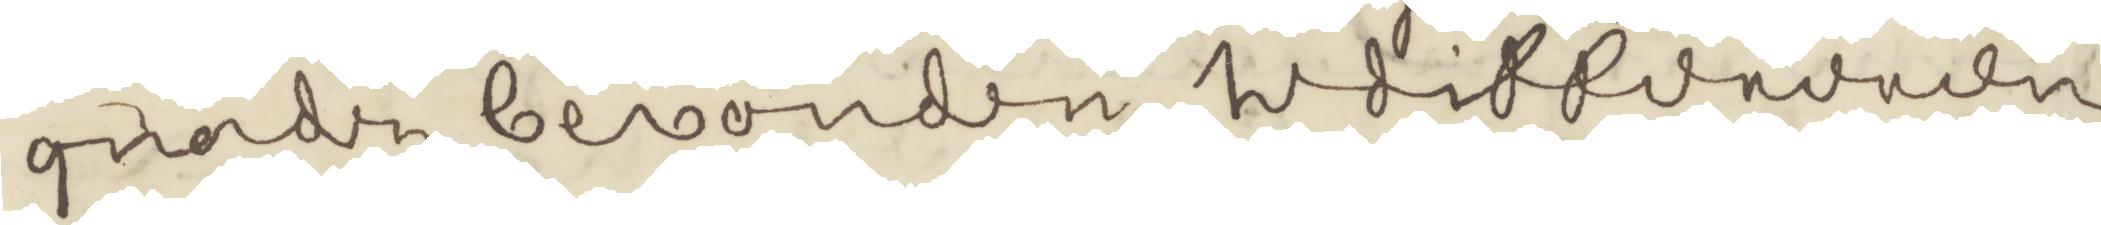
quaden bevonden te differeren
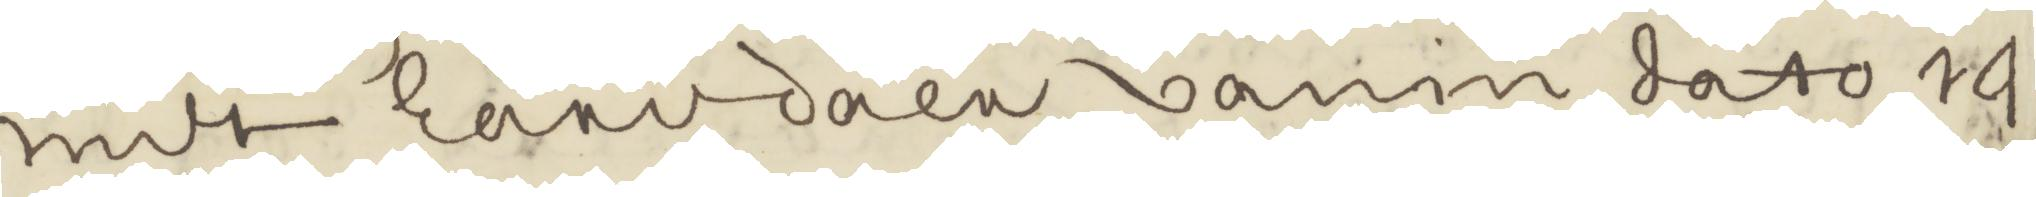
met hare daer van in dato 14
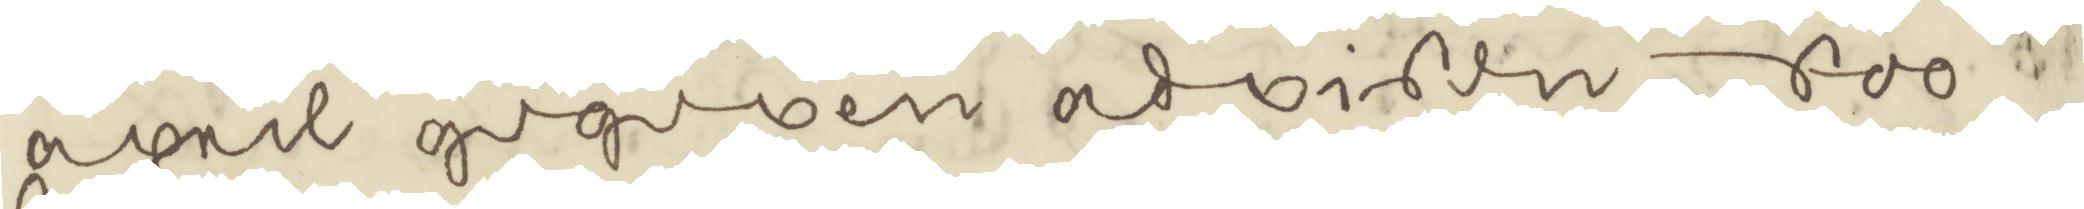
april gegeven advisen, soo
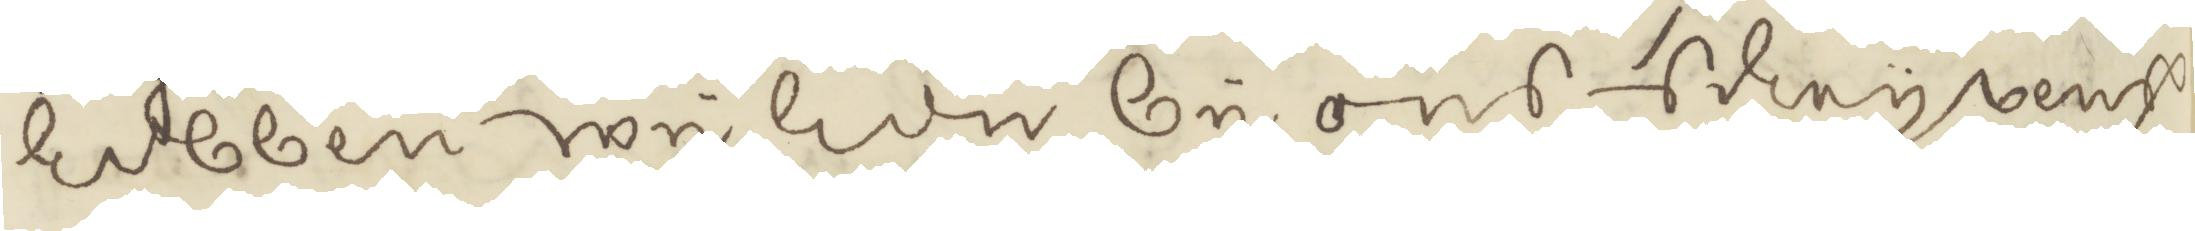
hebben wij hen bij ons schrijvens
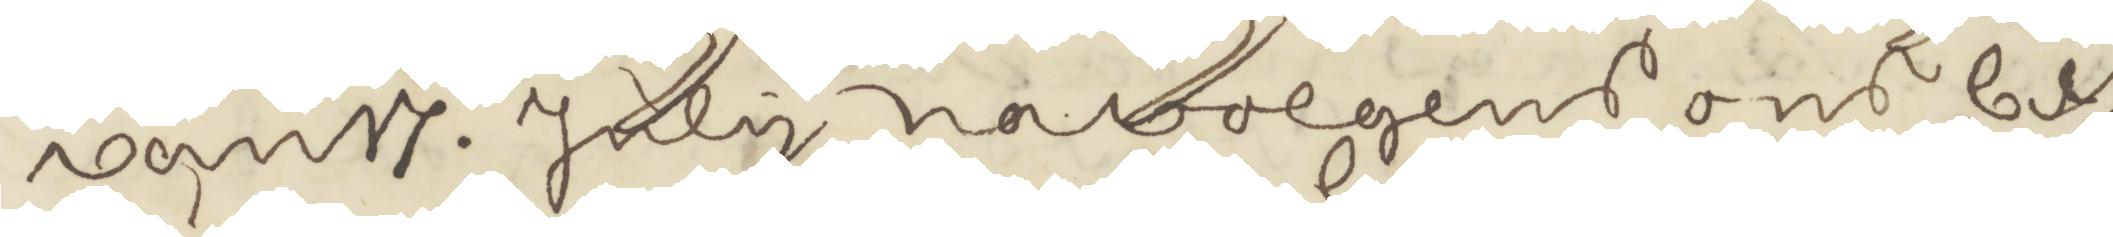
van 17. Julij navolgens ons be
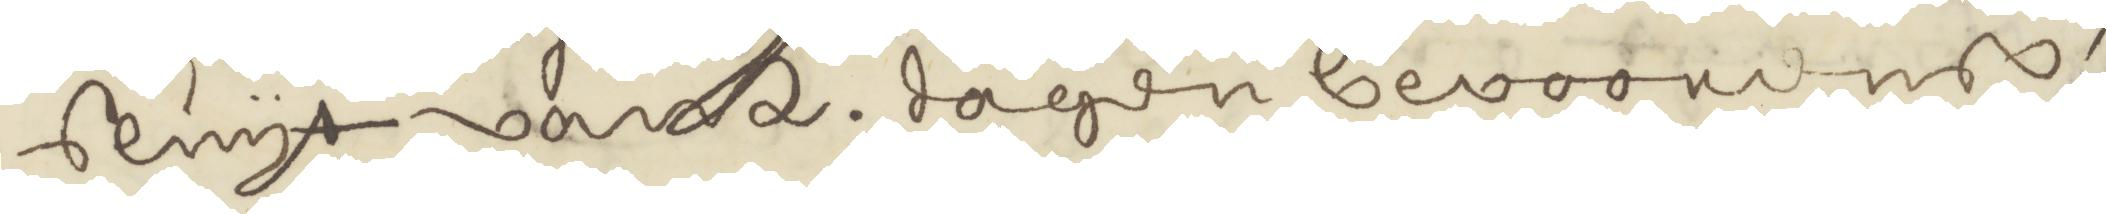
sluijt van 2. dagen bevoorens
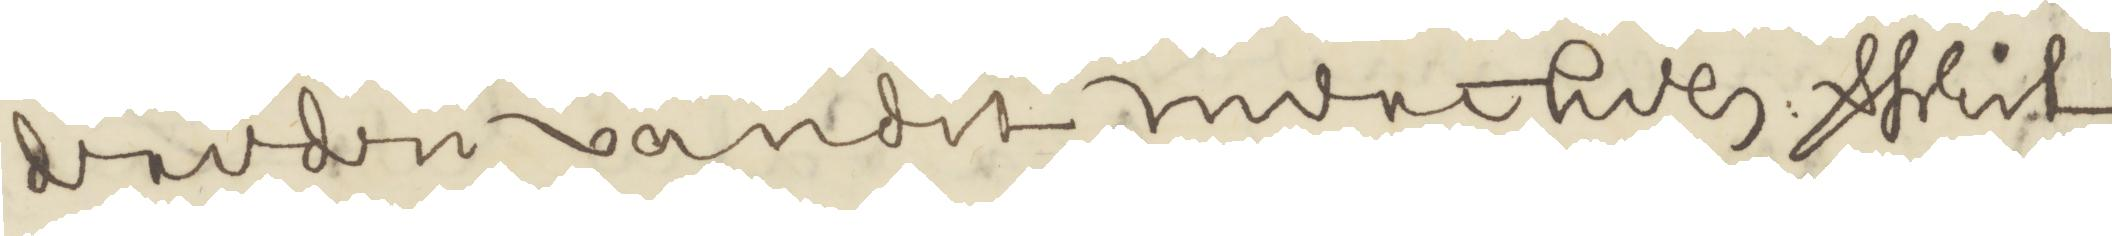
de reden van dit merckelijk verschil
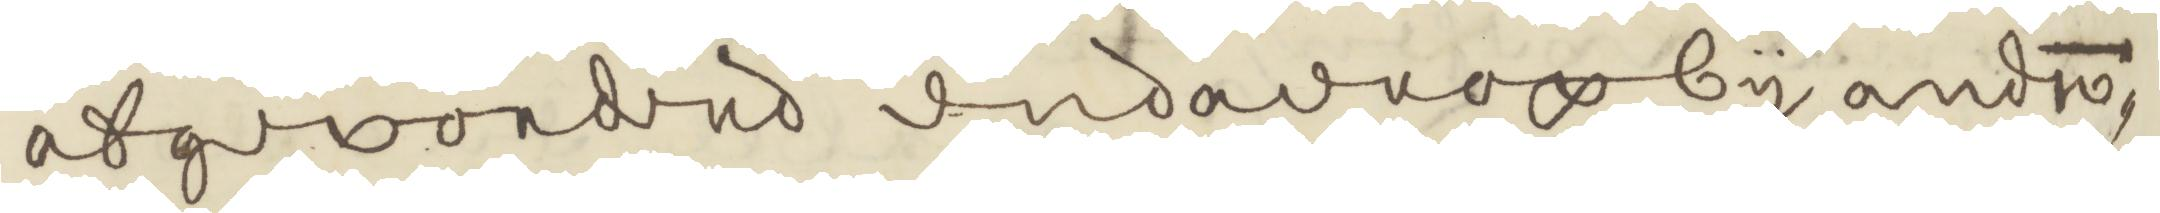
afgevorderd en daerop, bij andw„
